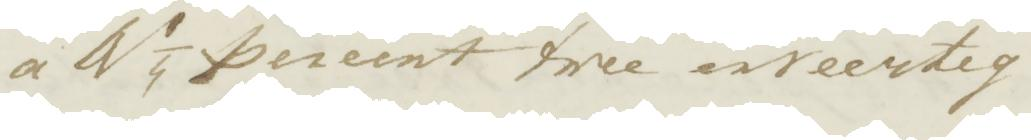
a 4¼ percent twee en veertig
